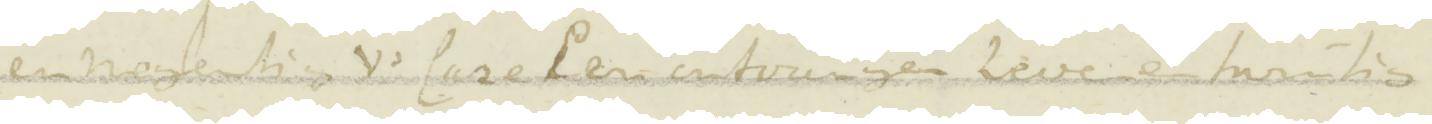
en negentig v' carel en ontvangen zeven en twintig
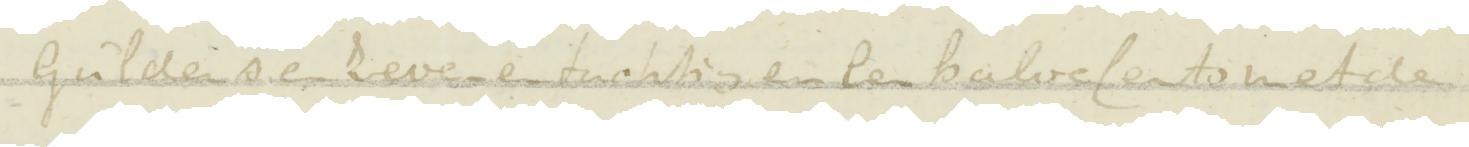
Guldens en zevenentachtig en Een halve Cents met de
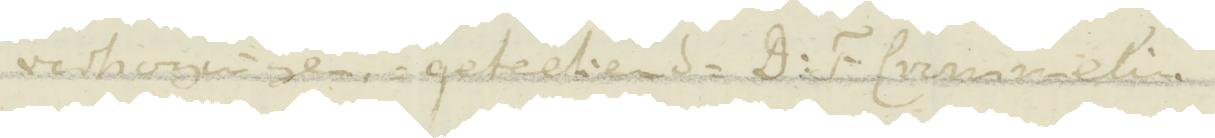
verhoogingen, = getekeend = D: F Crommelin.
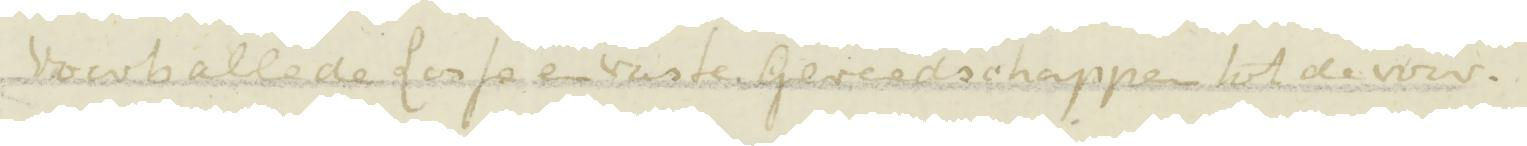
Voorts alls de Losse en vaste Gereedschappen tot de voor.
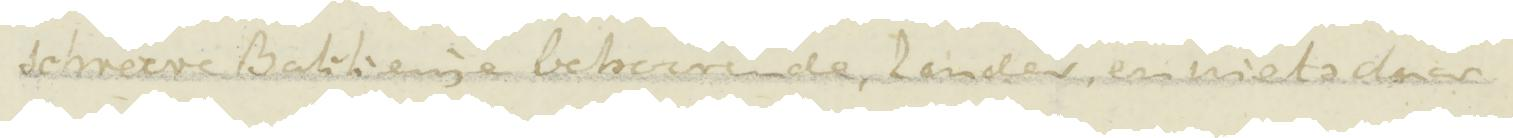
schreeve Bakkerije behoorende, zonder, en niets daar
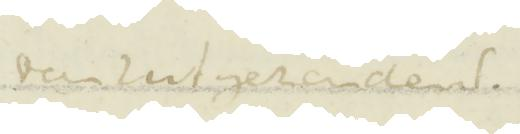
van uitgezonderd.
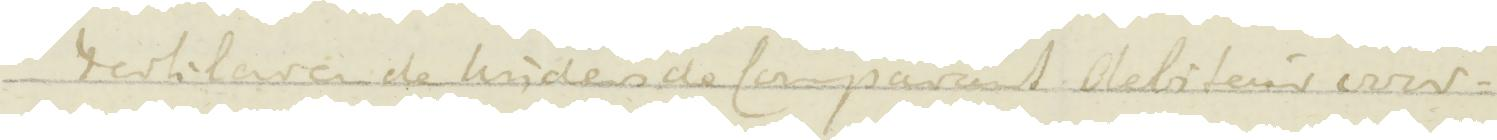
Verklarende wijders de Comparant debiteur voor=
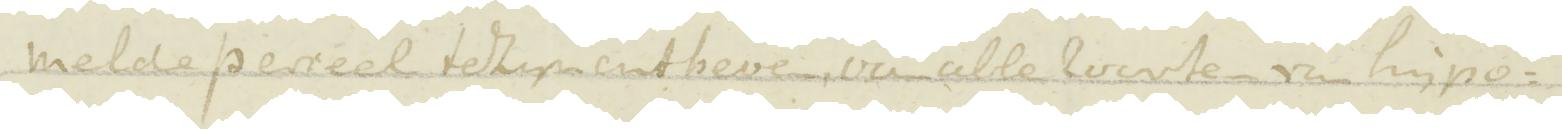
melde perceel te zyn ontheve, van alle zoorten van hijpo=
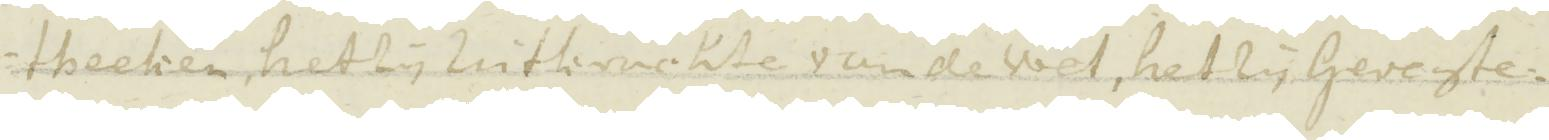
=theeken, hetzij uit vruchte van de wet, hetzij Geregte=
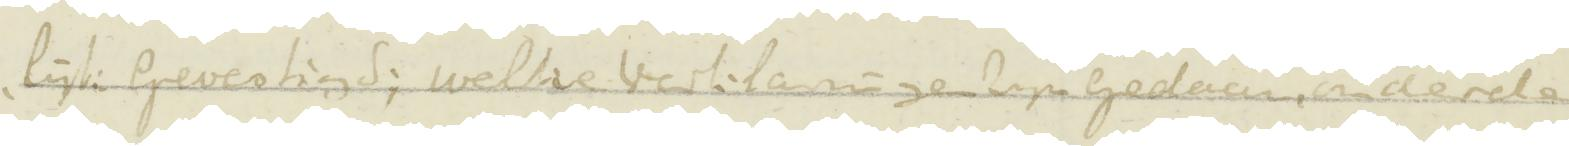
lijk Gevestigd; welke verklaringen zyn Gedaan, onder de
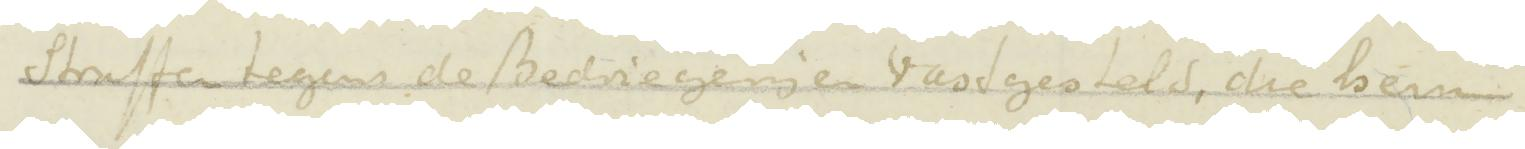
straffen tegens de Bedriegerij en vastgesteld, die hem
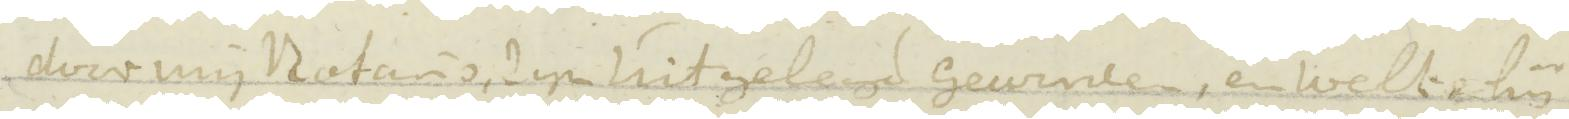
door mij Notaris, zyn uitgelegd geworden, en welke hij
